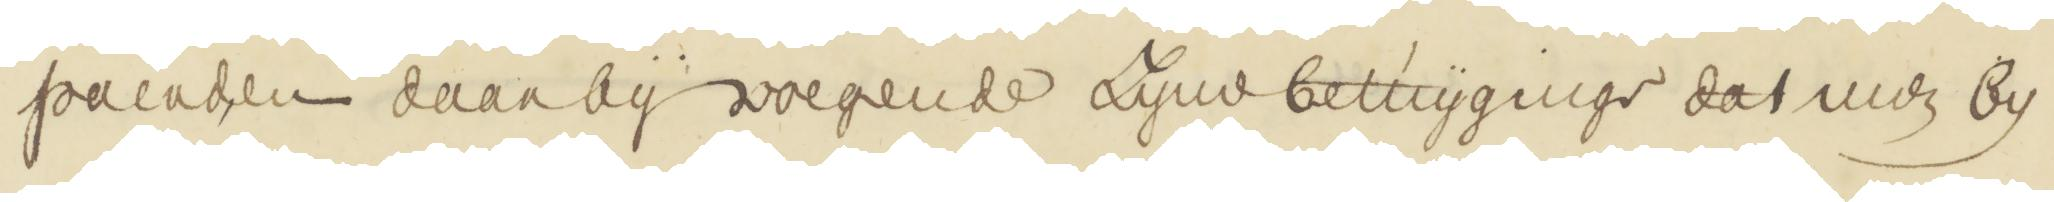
paerden daar bij voegende zyne betuijginge dat men by
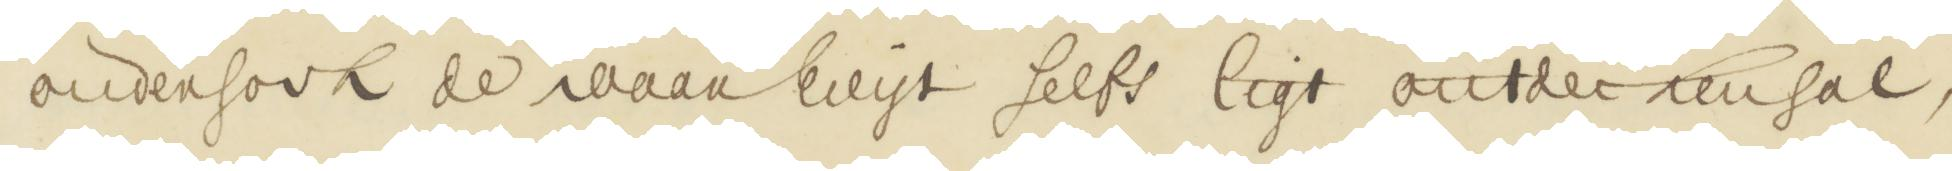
ondersoek de waarheijt selfs ligt ontdecken sal,
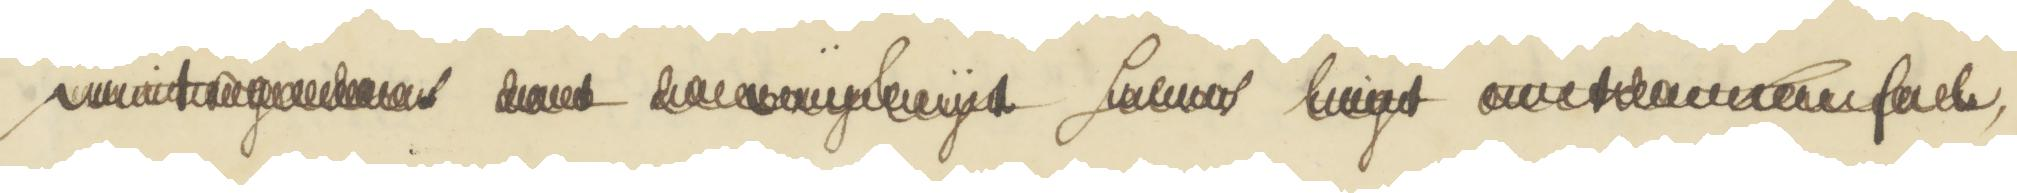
mitsgaders dat de vrijheijt selves ligt ontdecken sal.,
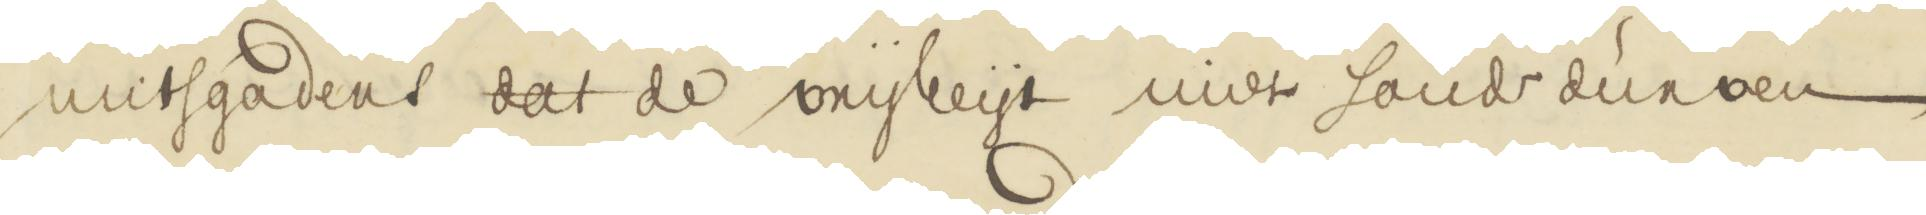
mitsgaders dat de vrijheijt niet soude durven
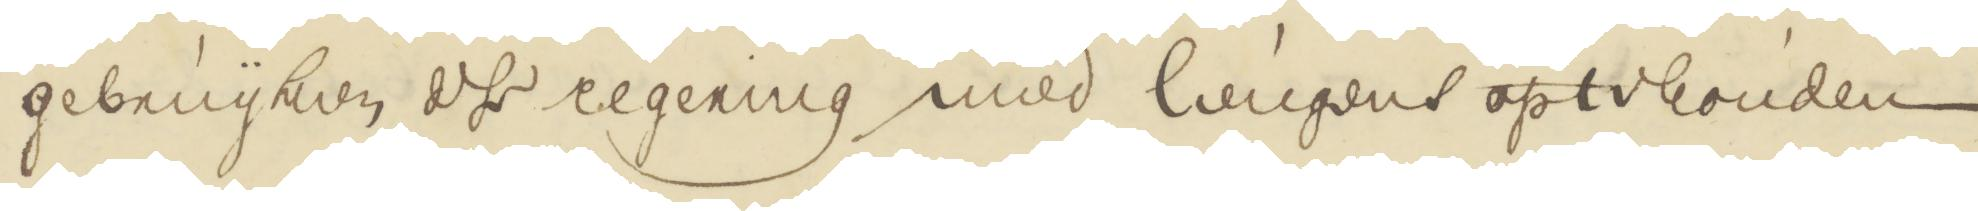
gebruijken dese regering med leugens optehouden
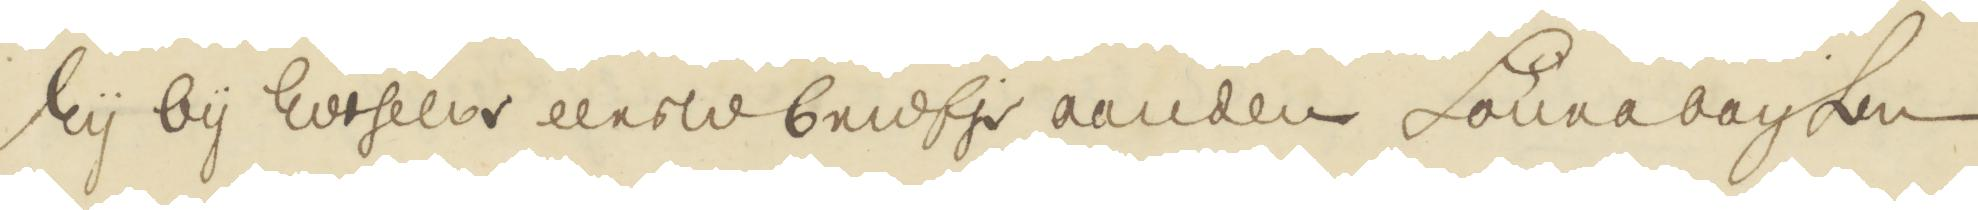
hij bij hetselve eerste briefje aan den Sourabaijsen
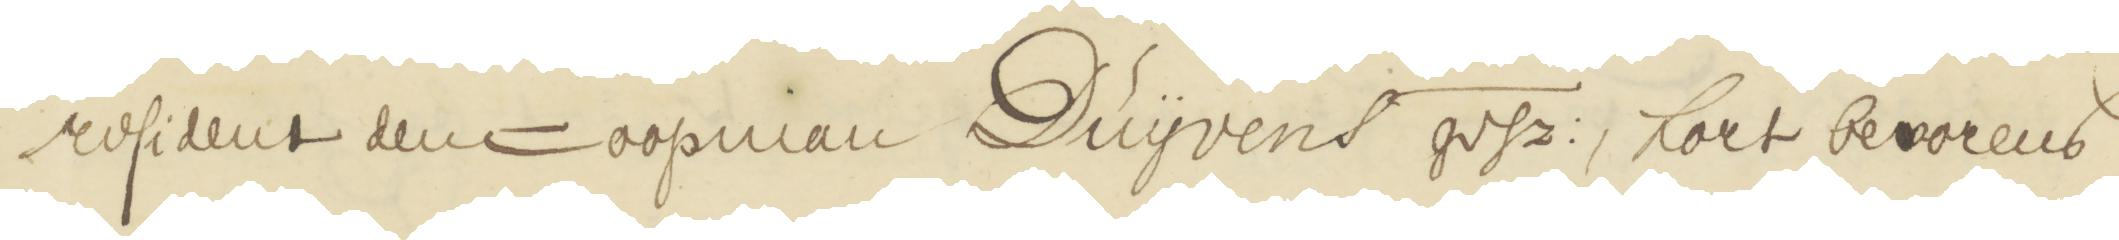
resident den coopnian Duijvens gesz:, kort bevorens
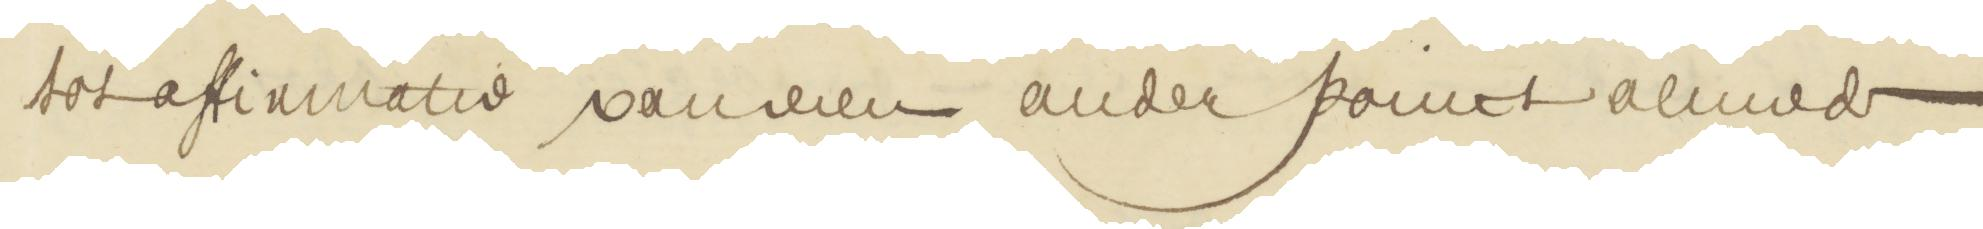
tot affirmatie van een ander poinct almede
